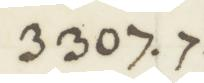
3307.7.
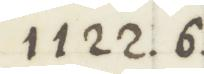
1122.6. 2/15„
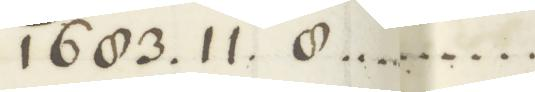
1683.11.8. . . . . . .
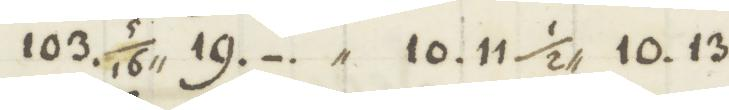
103. 5/16„ 19.-. „ 10.11½„ 10.13
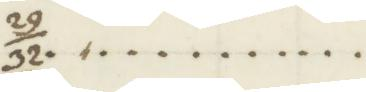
29/32.„ . . . . . . . . .
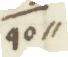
33/40„
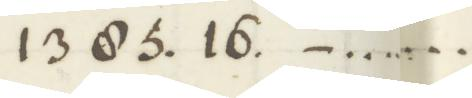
1385.16.-
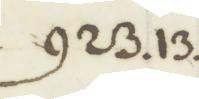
923.13.
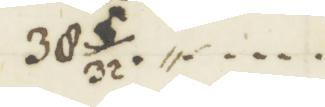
38 5/32.„. . - -
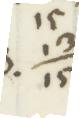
13/15„
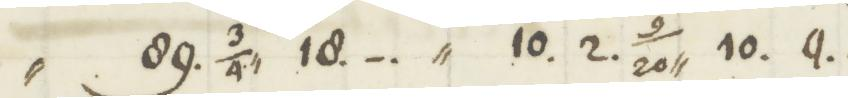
89. 3/4„ 18.—. „ 10.2. 9/20„ 10. 4.
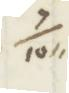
7/10„
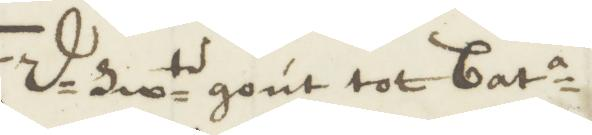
r=l sw=te gout tot bat=a
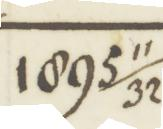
1895 11/32.
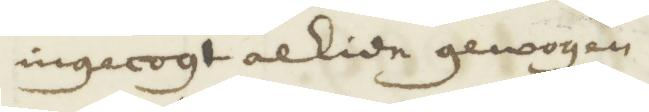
ingecogt alhier gewogen
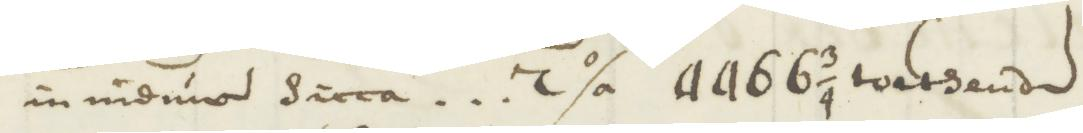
in nieuwe sicca . . . r o/a 4466 3/4 toetsende
